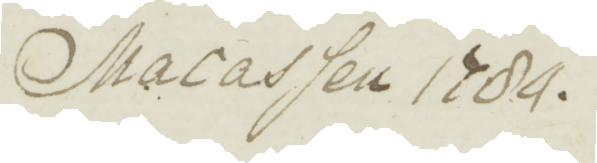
Macasser 1784.
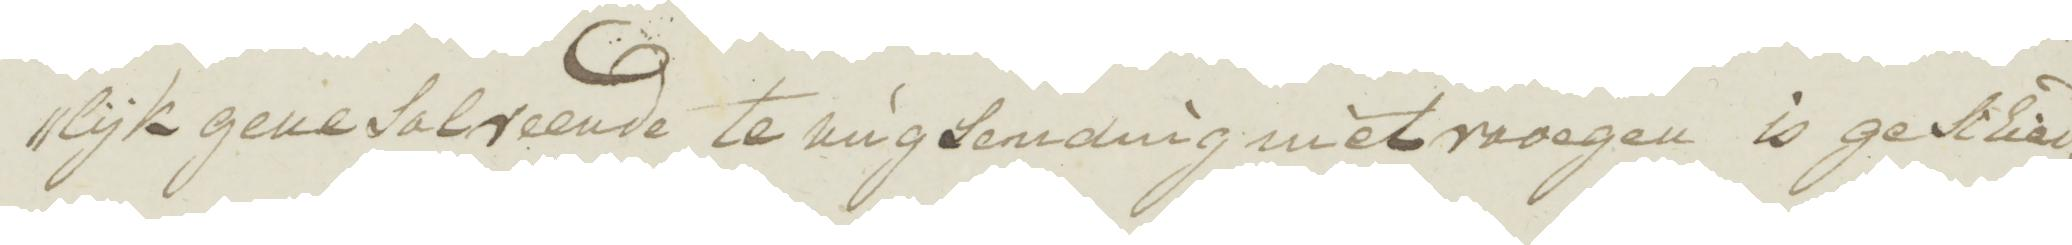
„lijk geresolveerde te rugsending niet vroeger is geschie
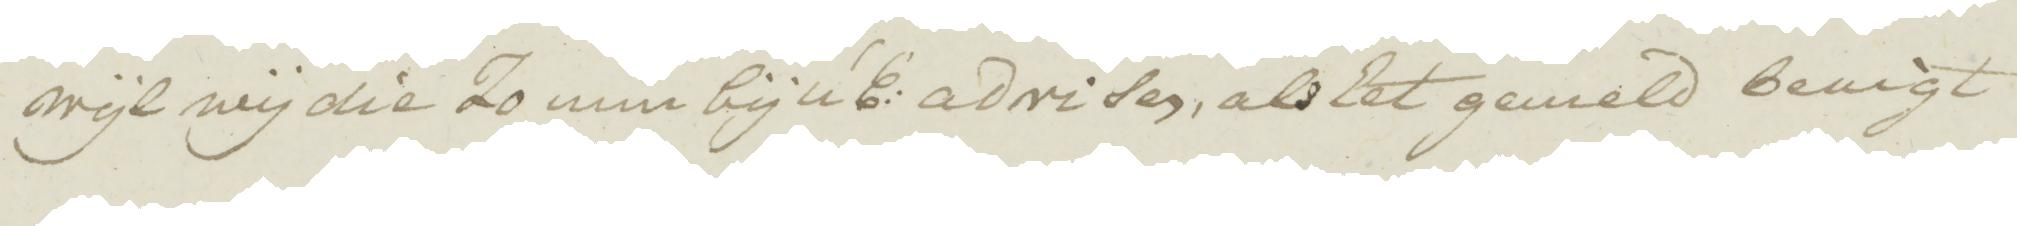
wijl wij die zo min bij uE: advisen, als het gemeld berigt
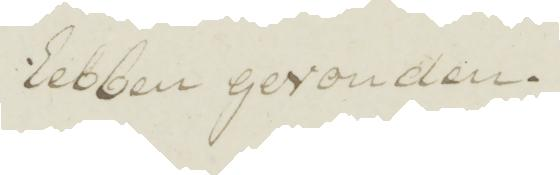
hebben gevonden.
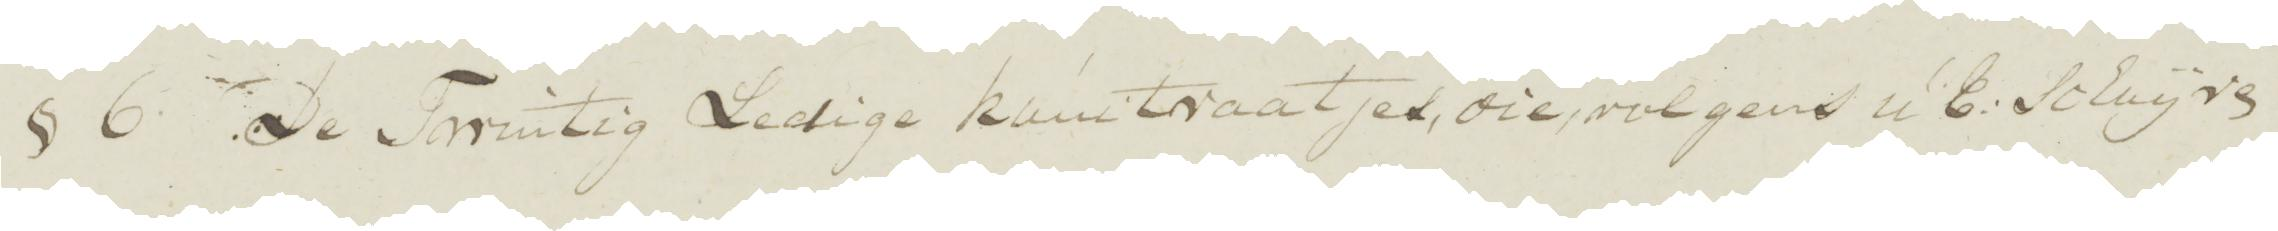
§ 6 De Twintig ledige kruitvaatjes, die, volgens uE: schrijven
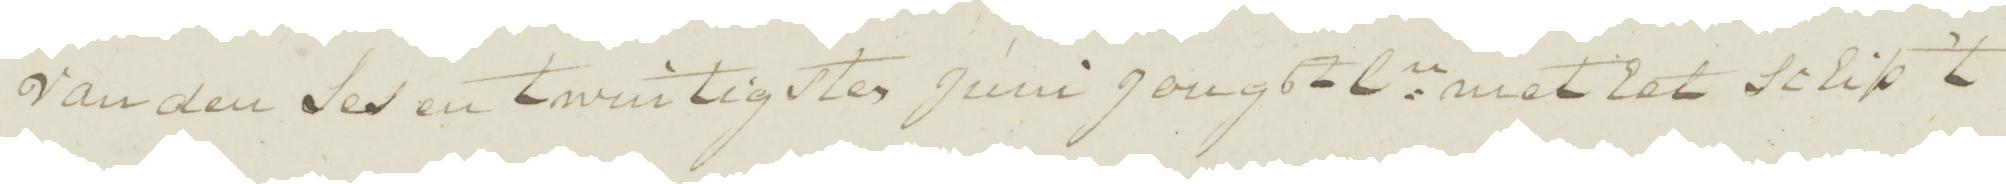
van den ses en twintigsten juni jongstl:n met het schip ’t
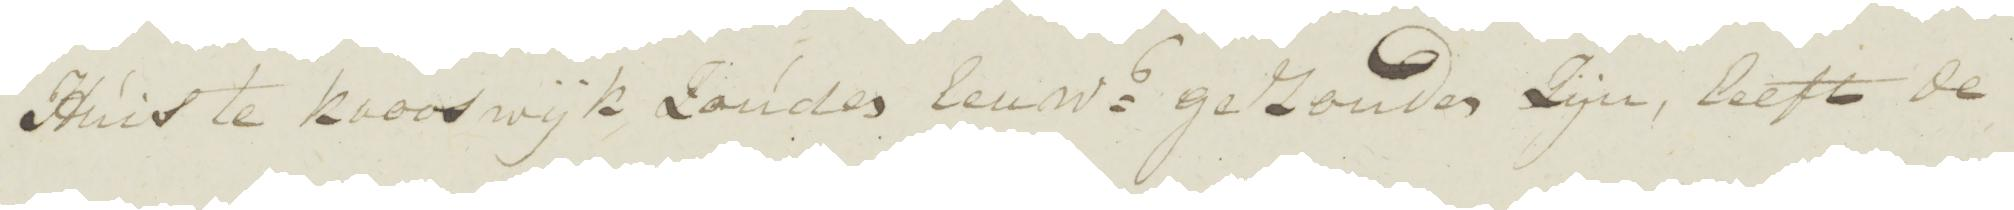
Huis te krooswijk, zouden Eerw:s gezonden zijn, heeft de
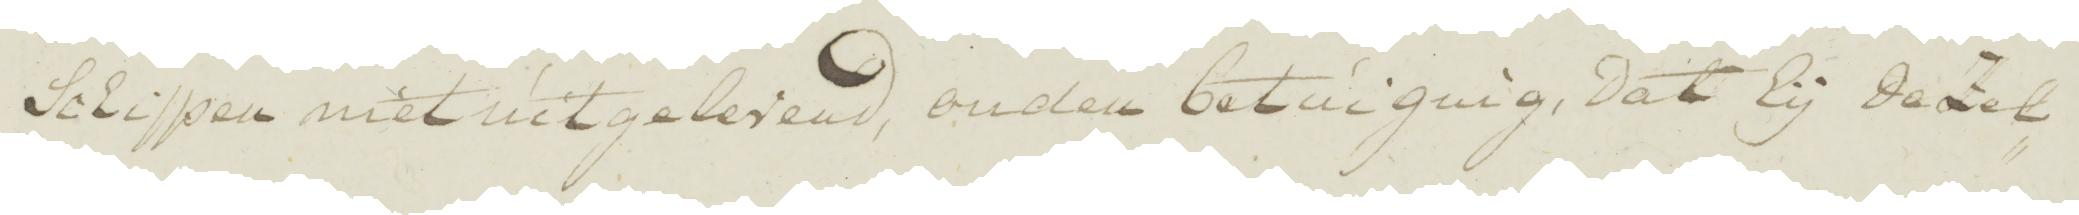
schipper niet uitgeleverd, onder betuiging, dat hij dezel„
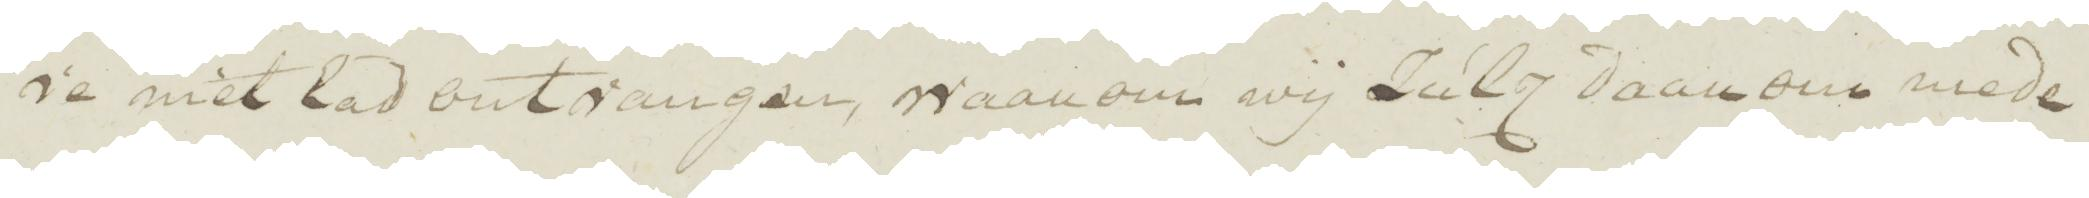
ve niet had ontvangen, waarom wij zulx daarom mede
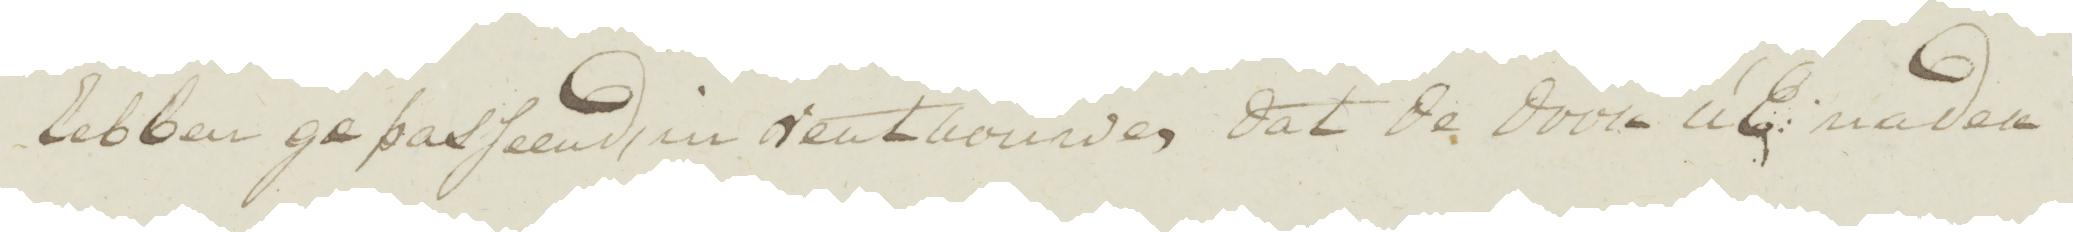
hebben gepasseerd, in vertrouwen dat de door uE: nader
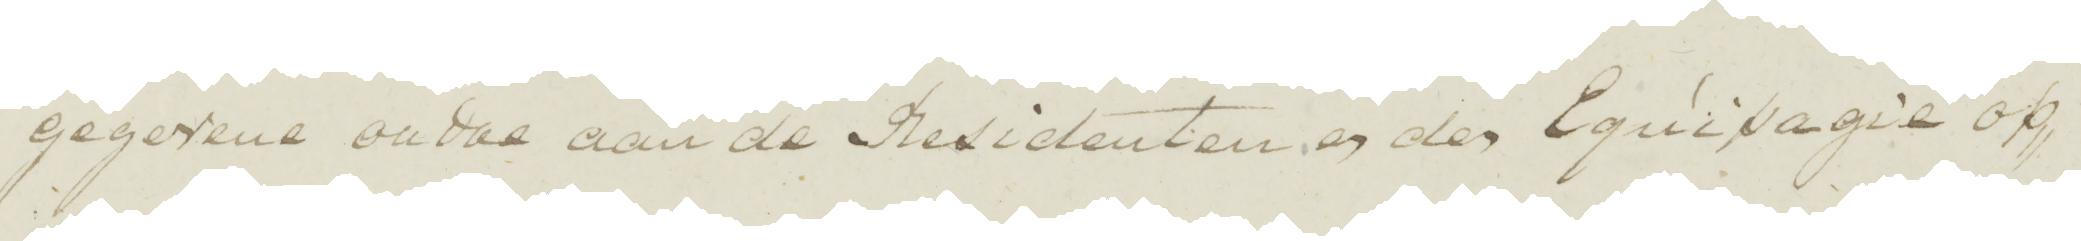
gegevene ordre aan de Residenten en den Equipagie op„
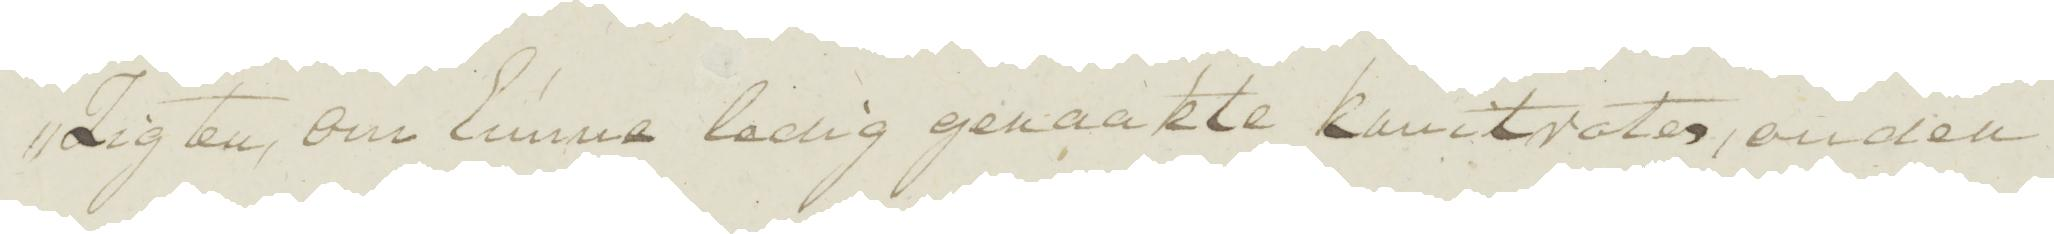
„zigter, om hunne ledig geraakte kruitvaten, onder
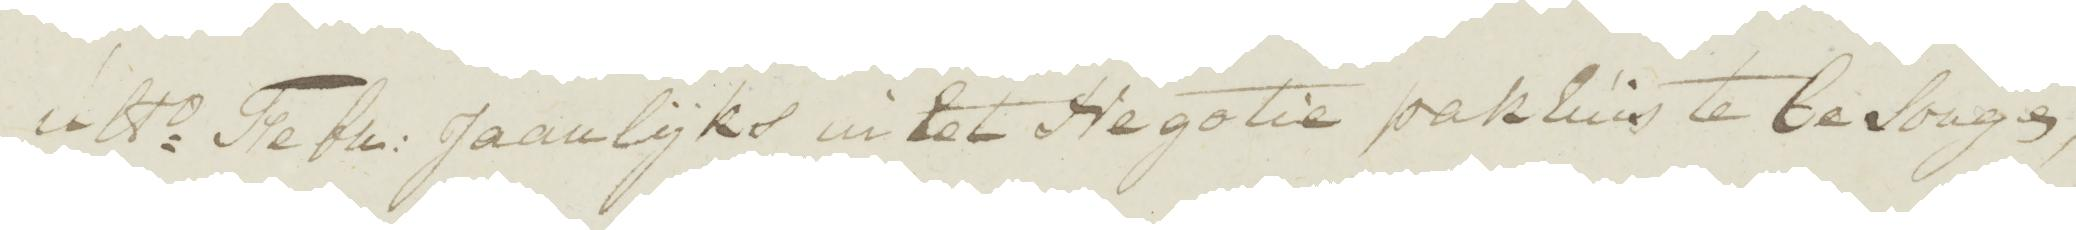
ult:o Febr: jaarlijks in het Negotie pakhuis te besorgen,
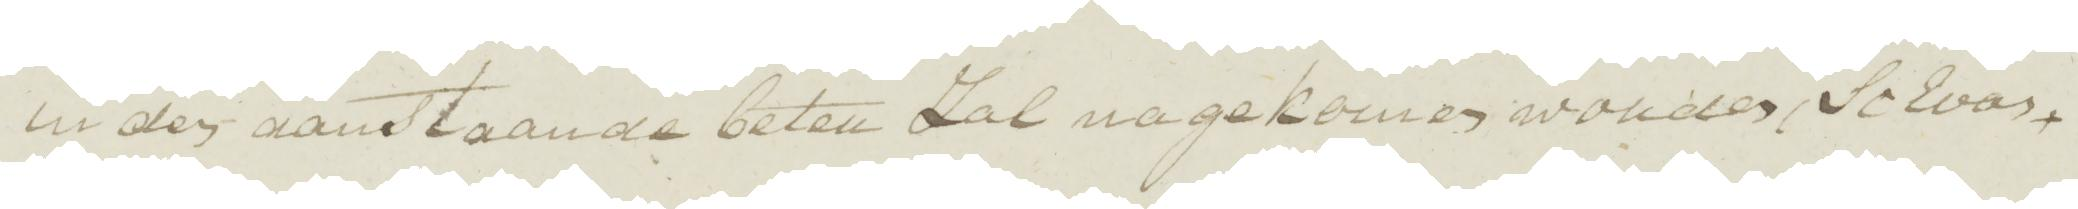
in den aanstaande beter zal nagekomen worden, schoon,
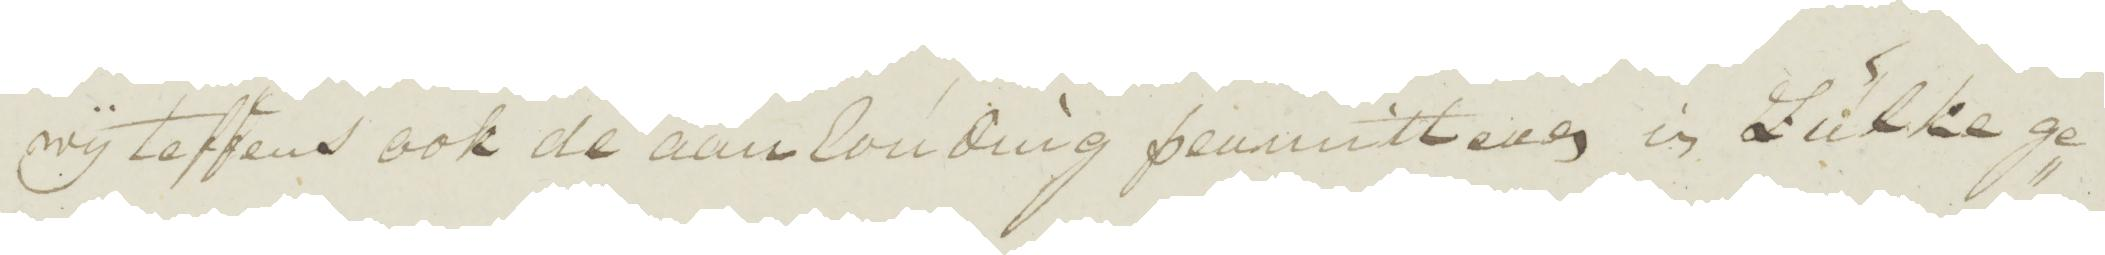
wij teffens ook de aanhouding permitteren in zulke ge„
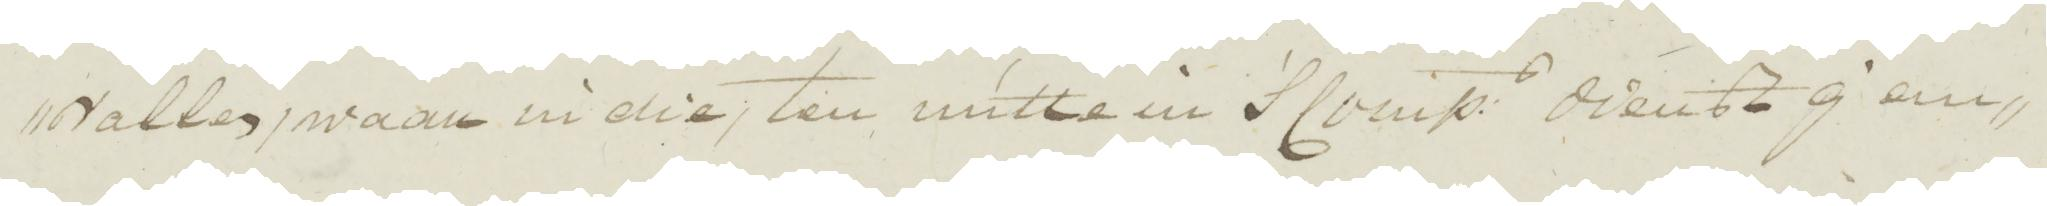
„vallen, waar in die, ten nutte in ’s Comp:s dienst g'em„
